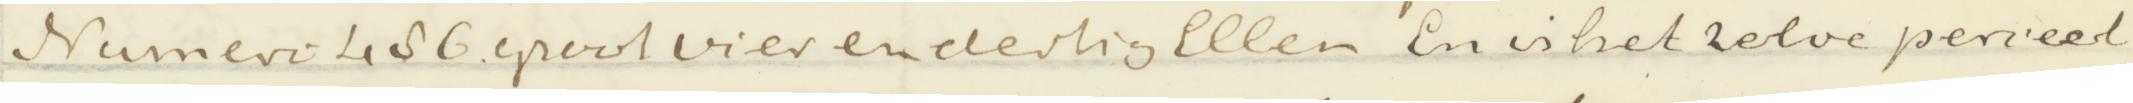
Numero 486. groot vier en dertig Ellen En is het zelve perceel
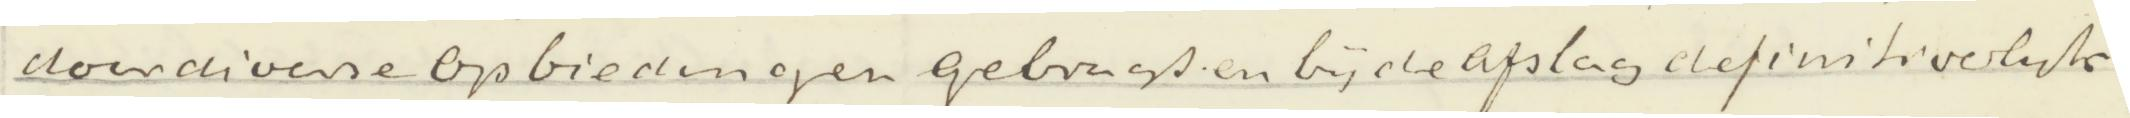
door diverse opbiedingen gebragt en bij de afslag definitivelyk
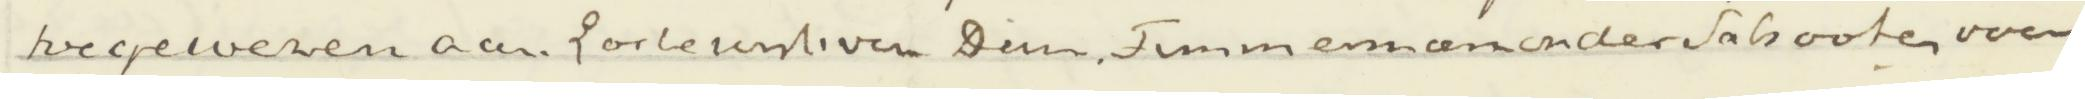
toegewezen aan Lodewyk van Dam, Timmerman onder schooten voor
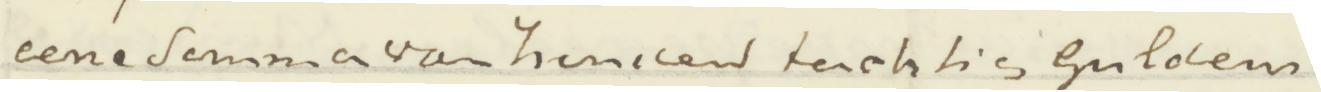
eene somma van honderd tachtig Guldens
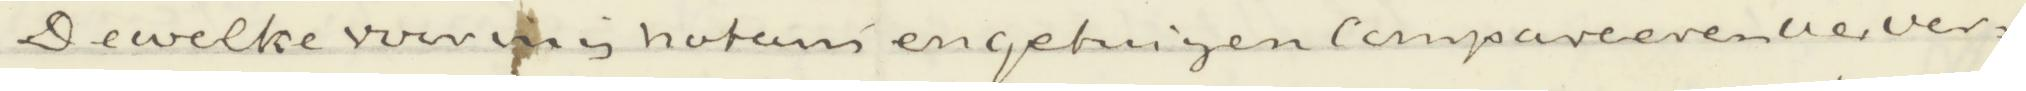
Dewelke voor mij notaris en getuigen compareerende, ver=
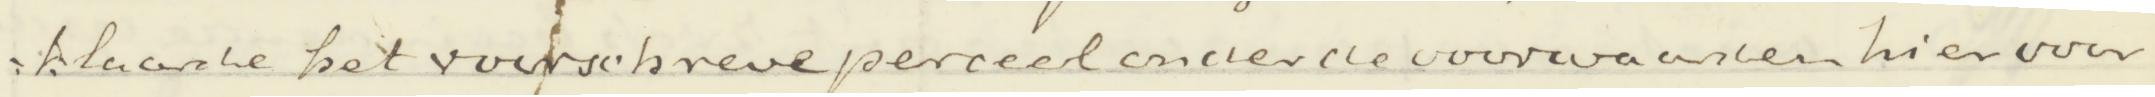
=klaarde het voorschreve perceel onder de voorwaarden hier voor
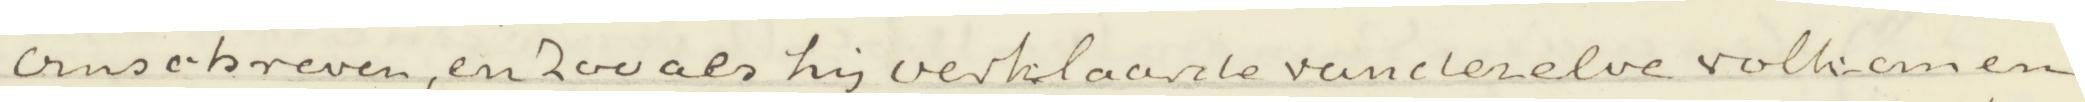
omschreven, en zoo als hij verklaarde van dezelve volkomen
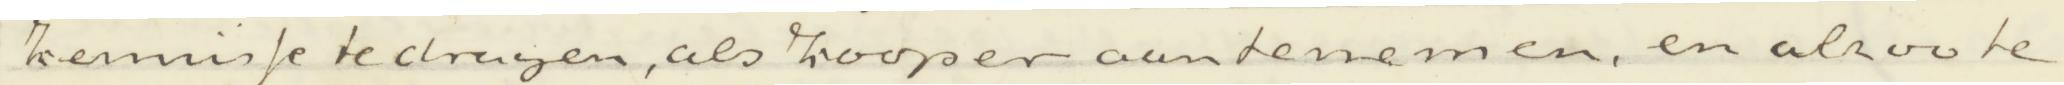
kennisse te dragen, als kooper aan tenemen, en alzoo te
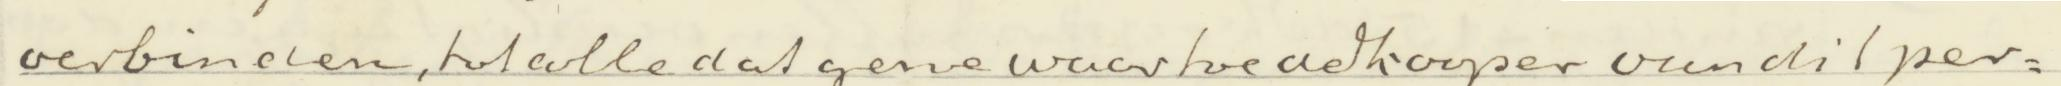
verbinden, tot alle dat gene waartoe de kooper van dit per=
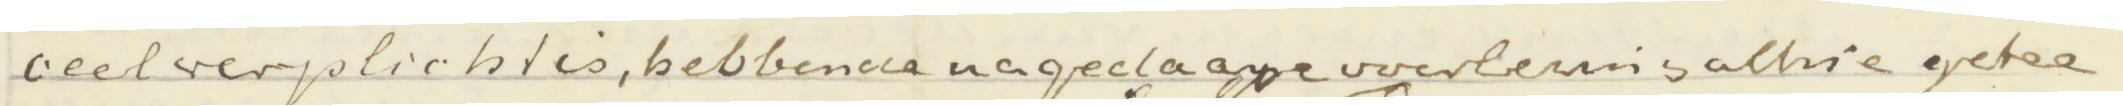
ceel verplicht is, hebbende nagedaane voorlezing alhier getee
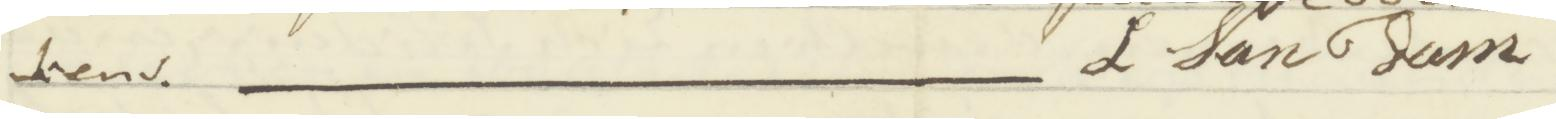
kend. L Van Dam
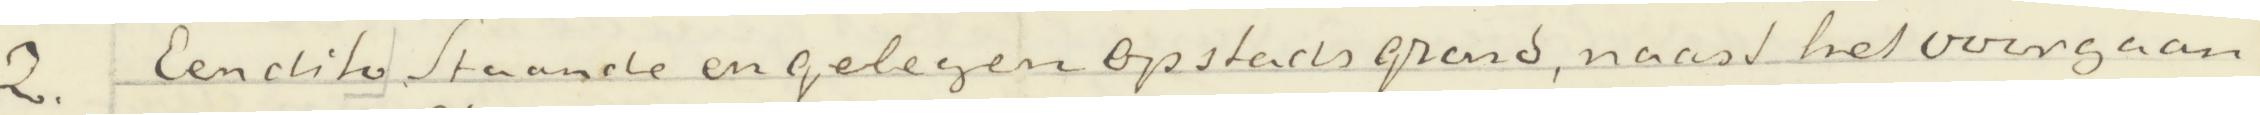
2. Een dito staande en gelegen op stads grond, naast het voorgaan
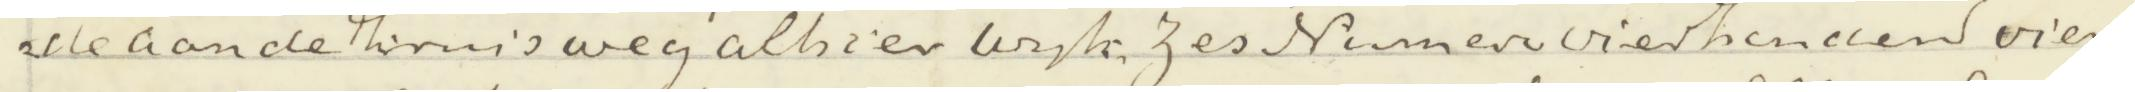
=de aan de kruisweg alhier wyk Zes Numero vierhonderd vier
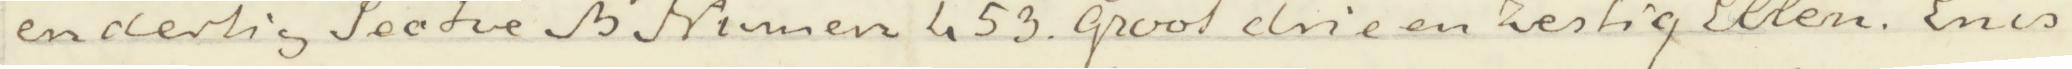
en dertig sectie B Numero 453. Groot drie en zestig Ellen. En is
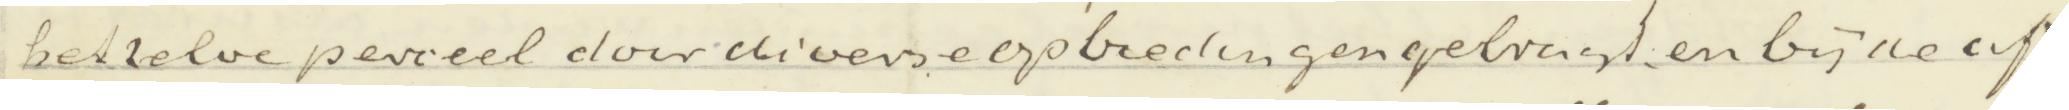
het zelve perceel door diverse opbiedingen gebragt en bij de af=
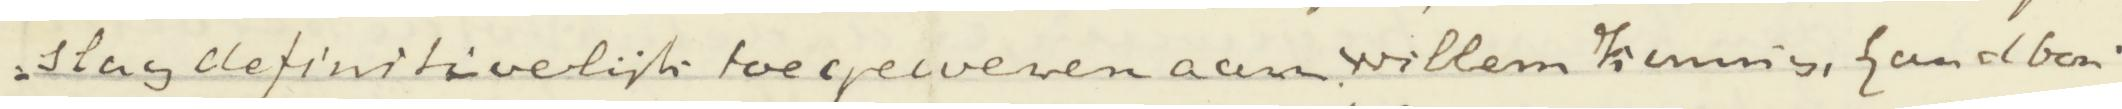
=slag definitivelijk toegewezen aan willem koning, Landbou
